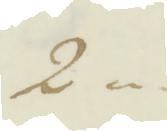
2 „ —
